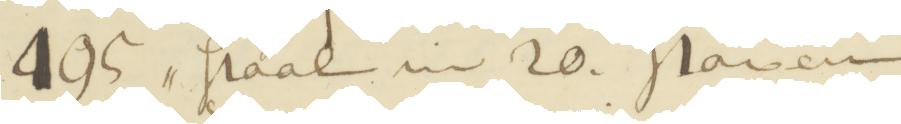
495 „ staal in 20. staven
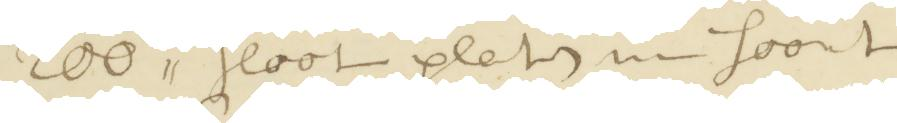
200 „ sloot platen in soort
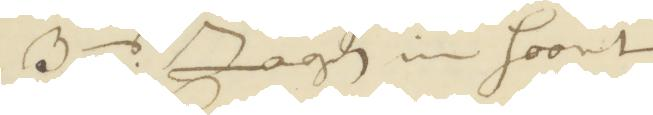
3 p:s zagen in soort
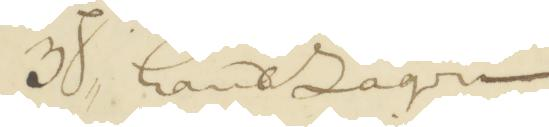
3 „ handzagen
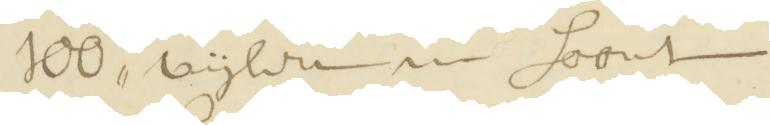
100 „ vijlen in soort
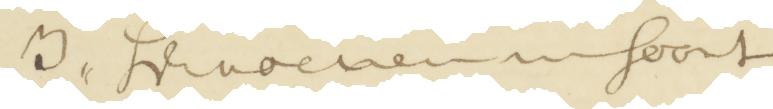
3 „ schroeven in soort
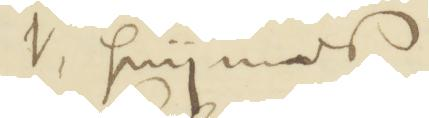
1 „ snij mes
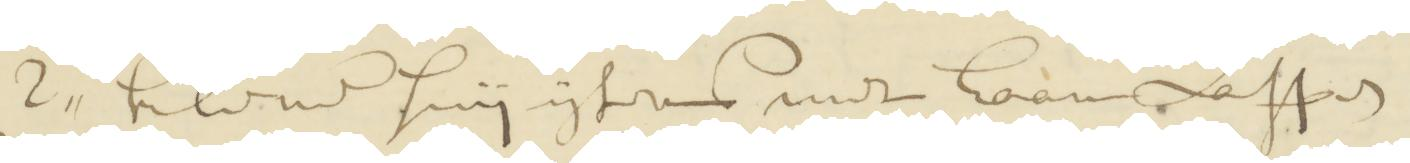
2 „ kleine snij ijsers met haanTappen
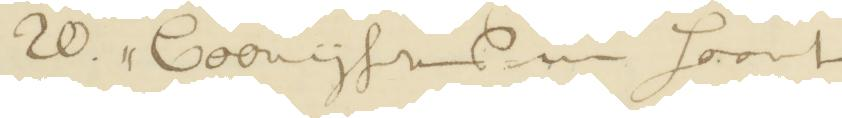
20. „ boorijsers in soort
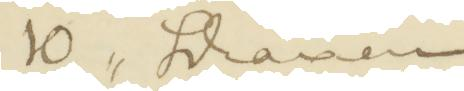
10 „ schaven
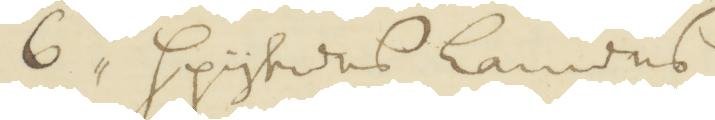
6 „ spijkers hamers
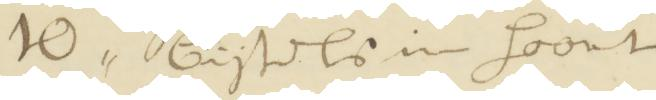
10 „ bijtels in soort
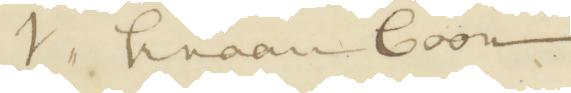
1 „ kraan boor
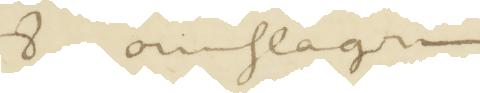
8 „ omslagen
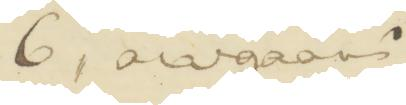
6 „ avergaars
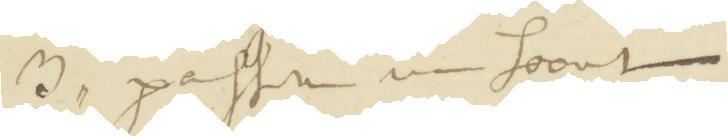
3 „ passer in soort
